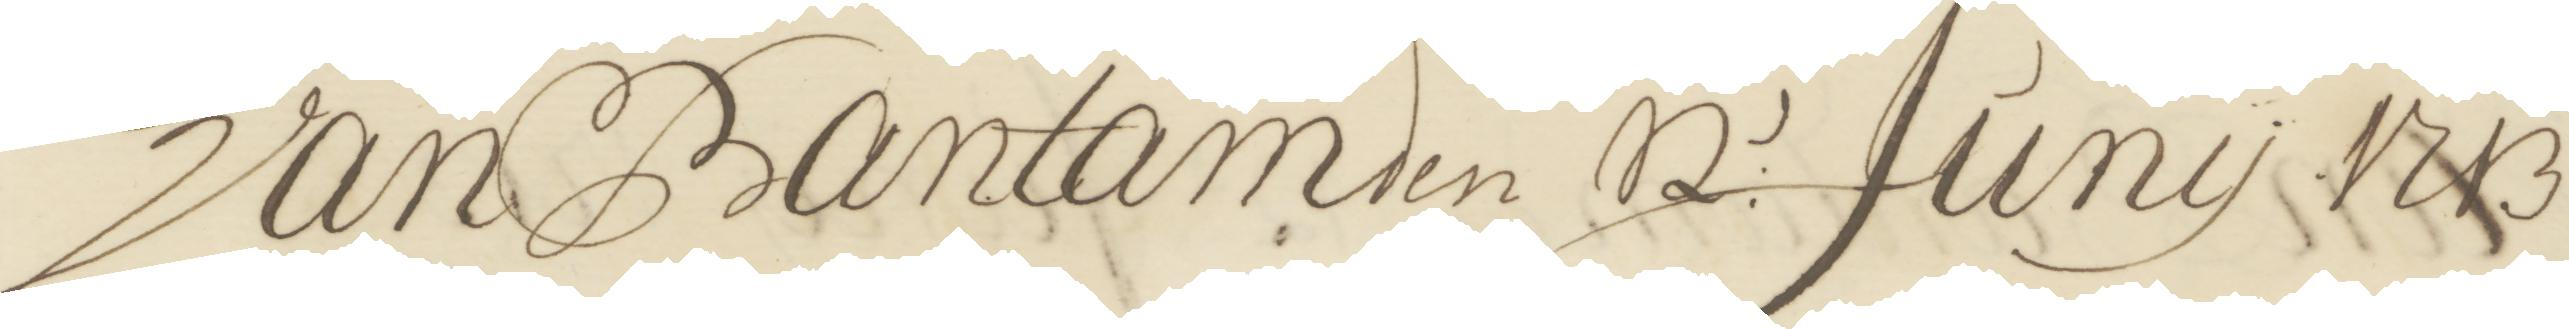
Van Bantam den 12:' Junij 1713
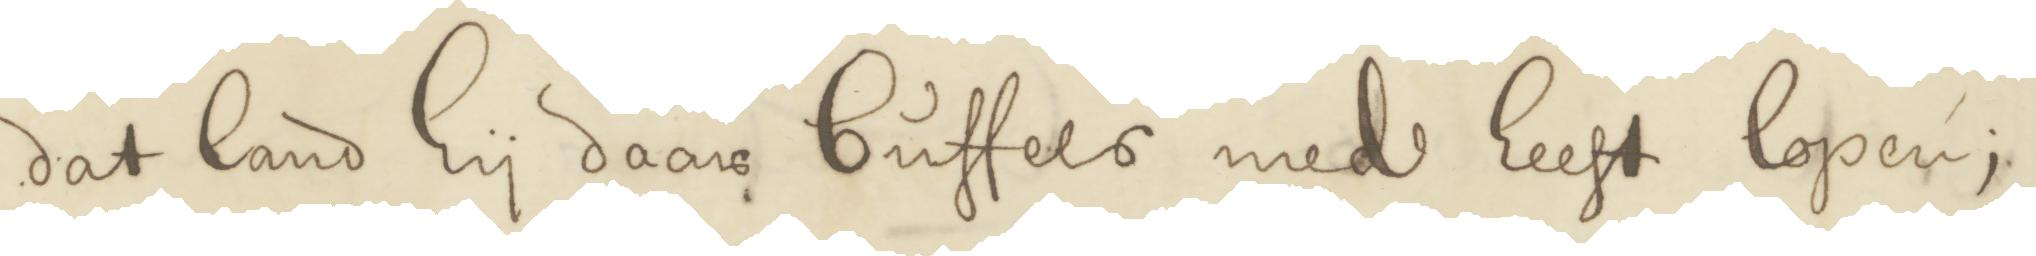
dat land hij daar buffels mede heeft lopen;
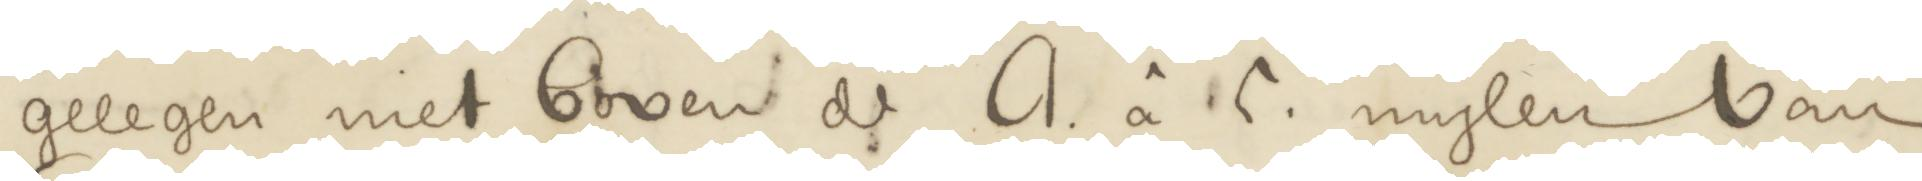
gelegen niet boven de 4. â 5. mijlen van
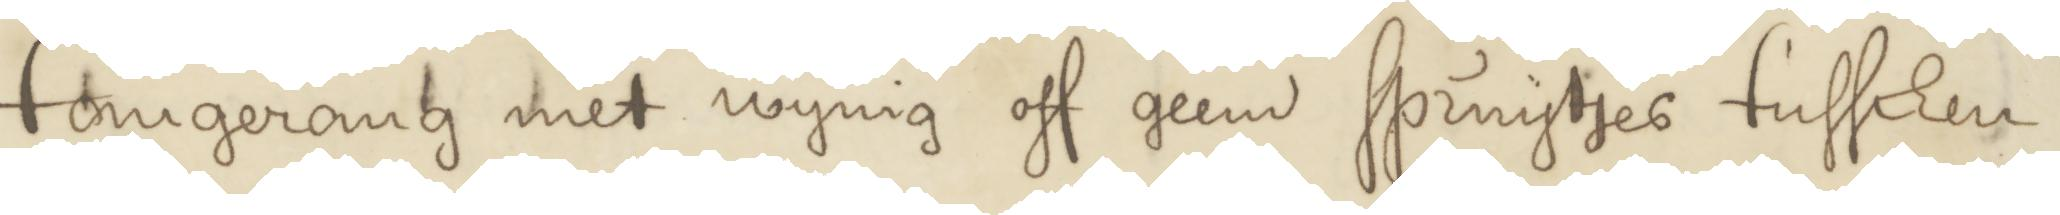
tangerang met wijnig off geene spruijtjes tusschen
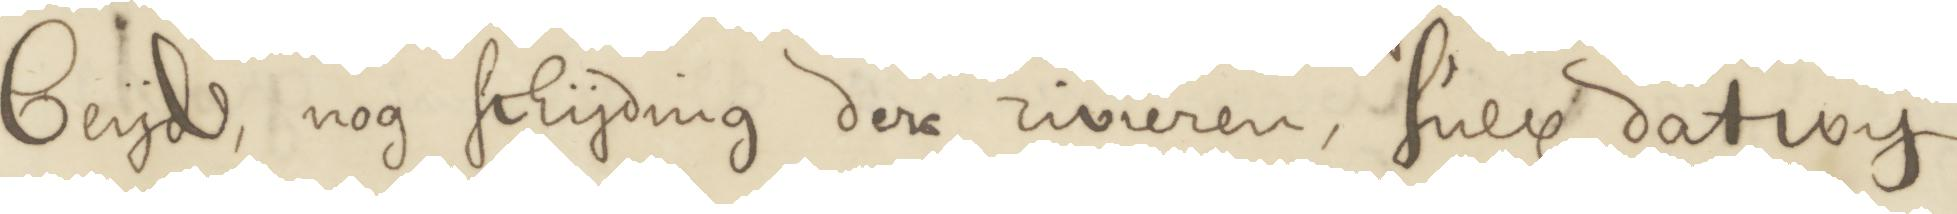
beijde, nog schijding der rivieren, sulx dat wij
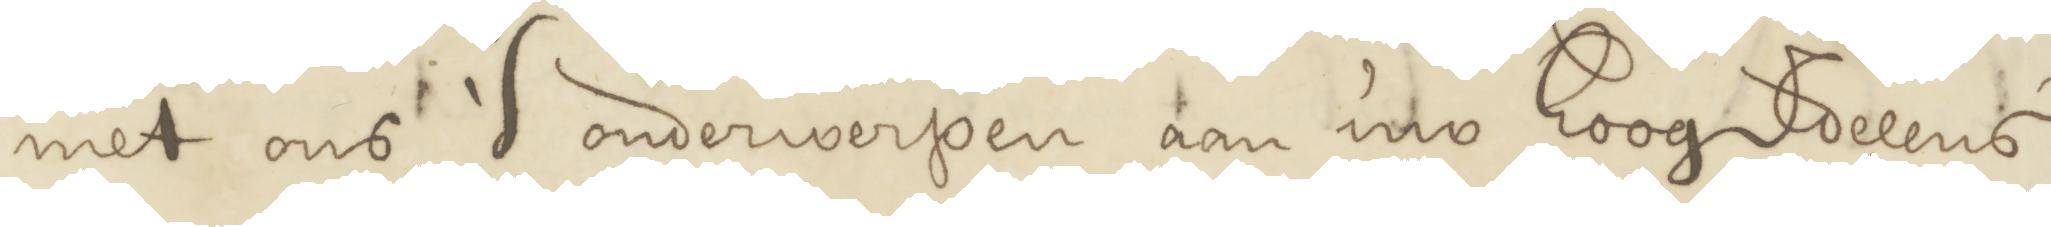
met ons ’t onderwerpen aan uw hoog Edelens
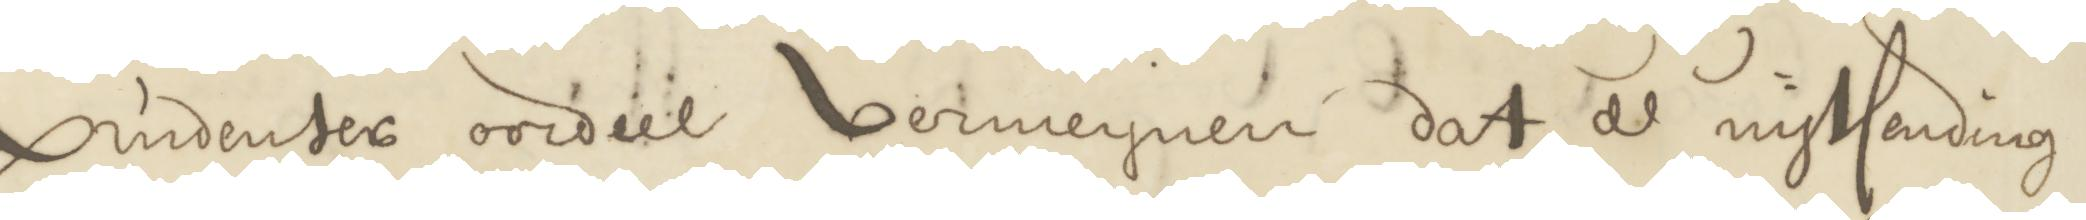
prudenter oordeel vermeijnen dat de uijtsending
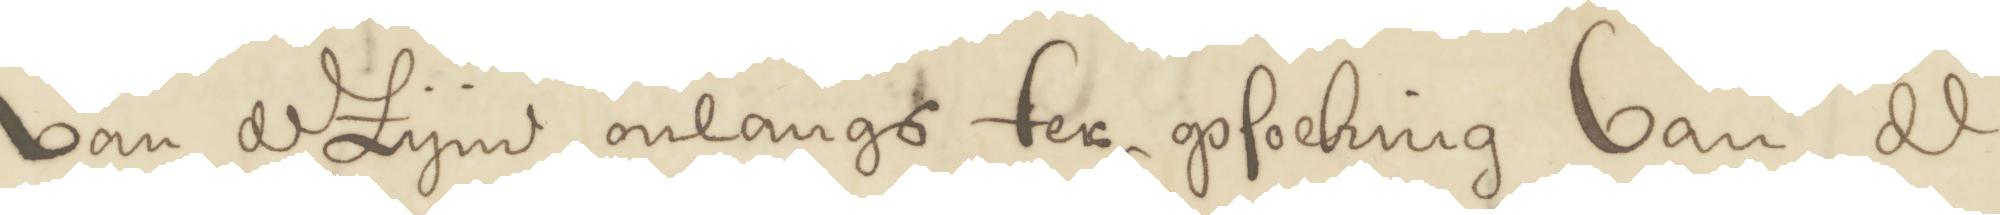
van de zijne onlangs ter opsoeking van de
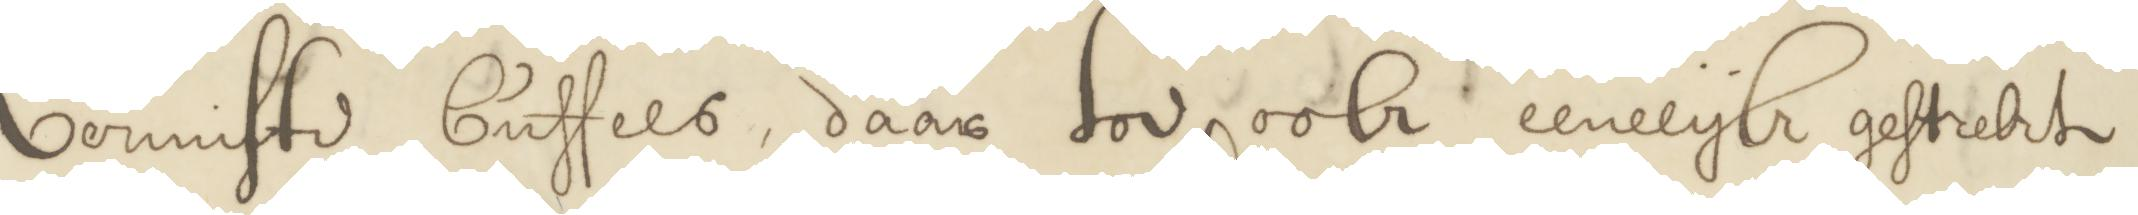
vermiste buffels, daar toe ook eenelijk gestrekt
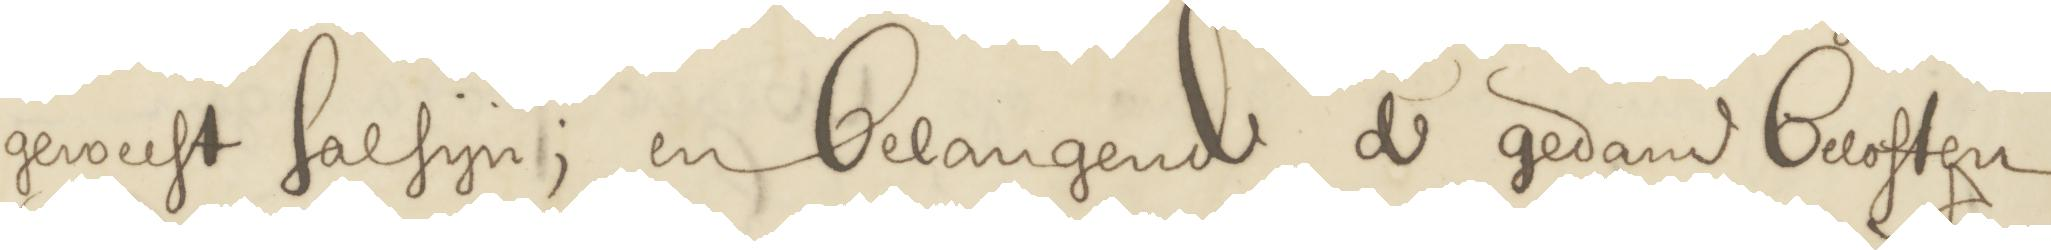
geweest sal sijn; en belangende de gedane beloften
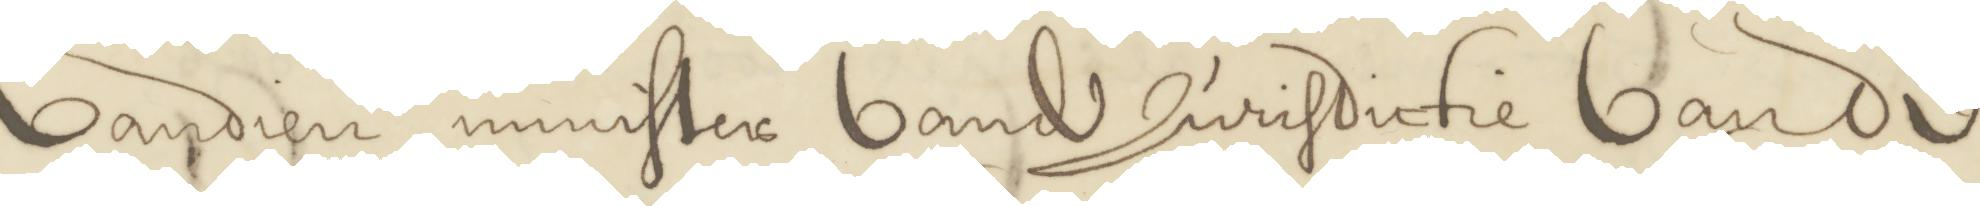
vandien minister vande Jurisdictie vand'S
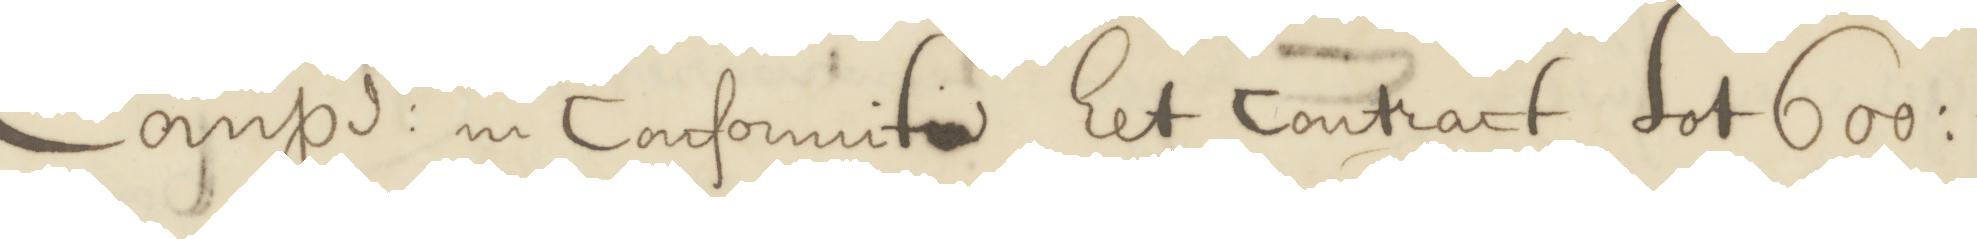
Comps: in conformitie het contract tot 600:
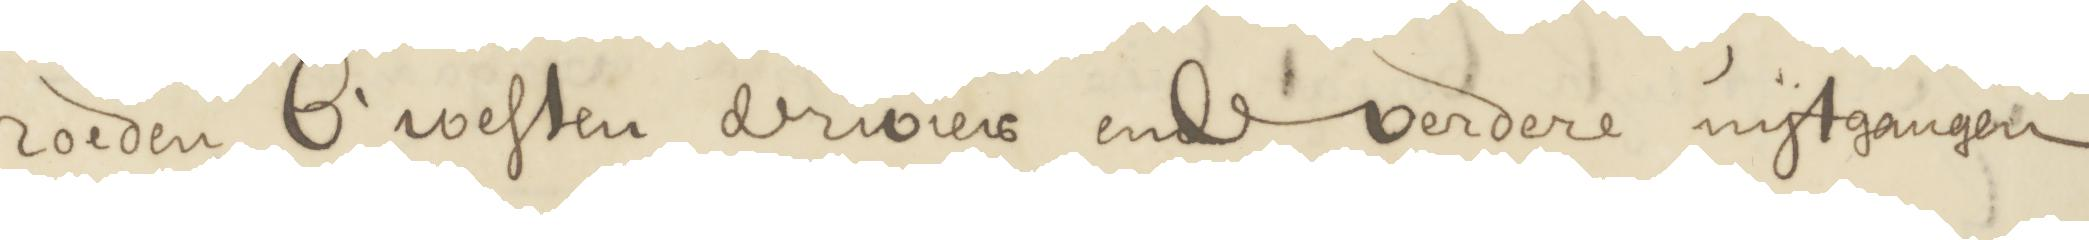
roeden b’westen derivier ende verdere uijtgangen
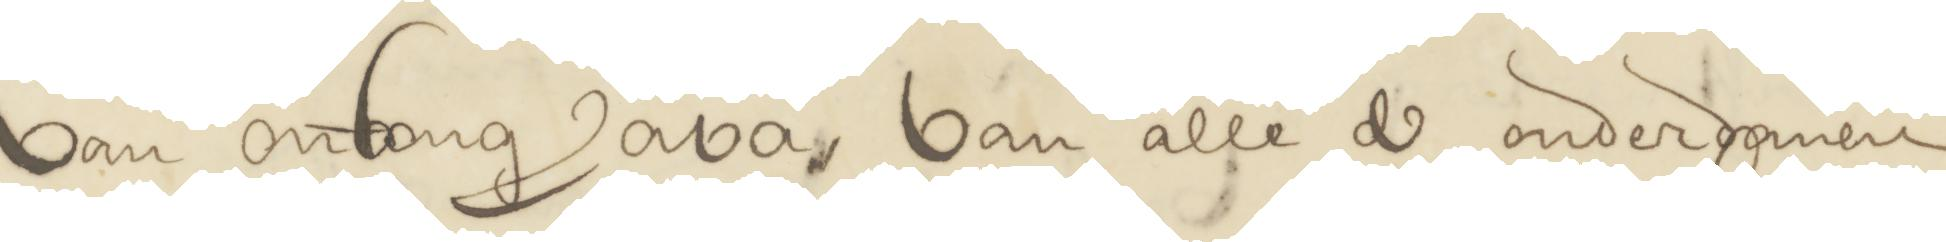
van ontong Java, van alle de onderdanen
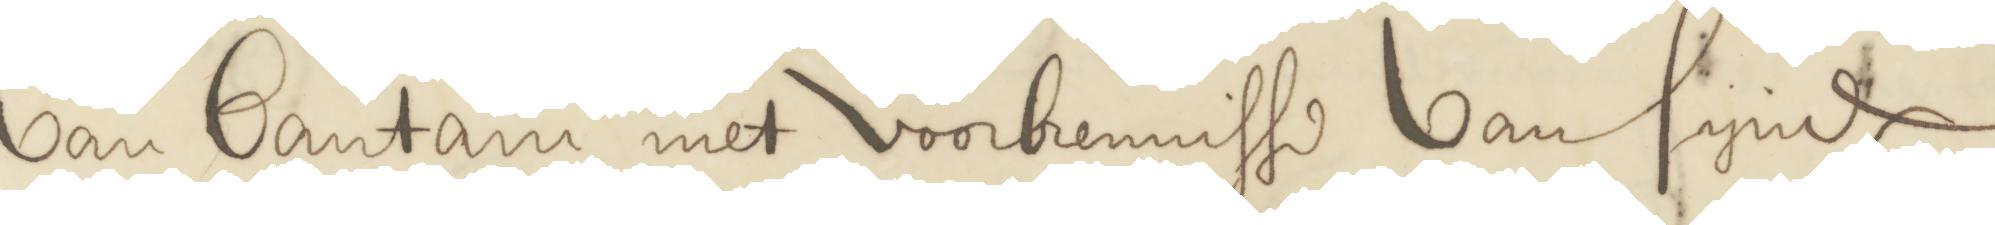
van bantam met voorkennisse van sijne
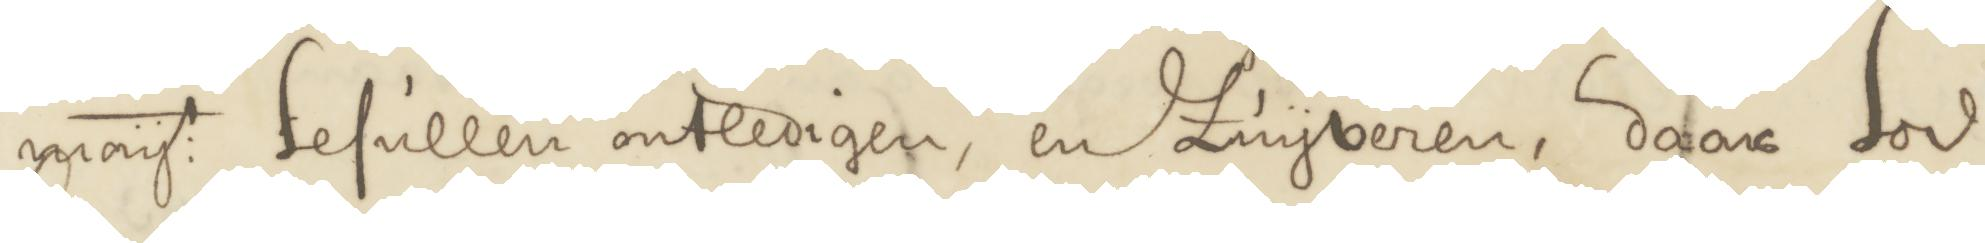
maij:t te sullen ontledigen, en zuijveren, daar toe
